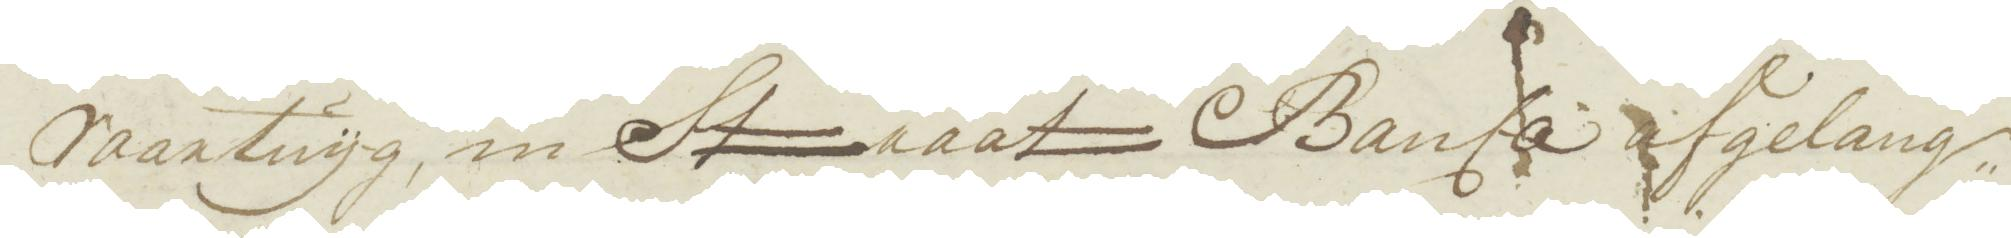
vaartuijg, in straat Banca afgelang„
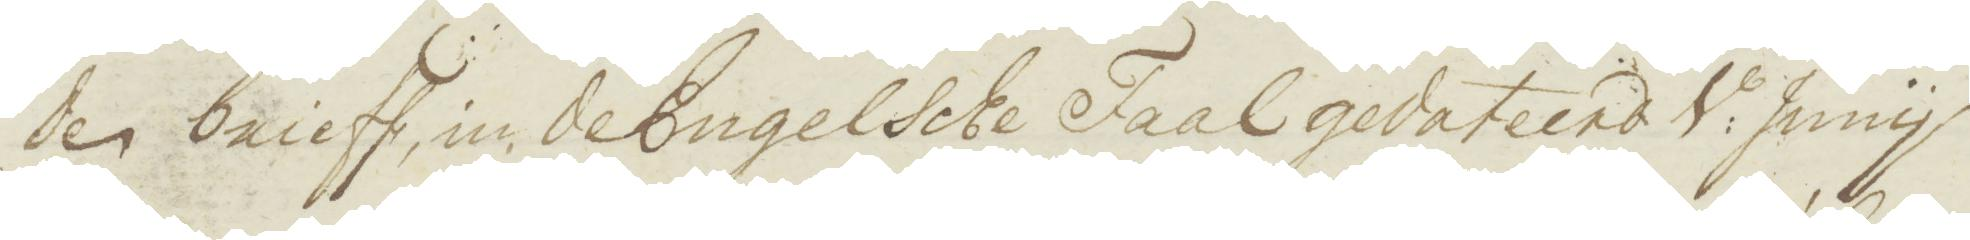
de brieff, in de Engelsche Taal gedateerd 1:e Junij
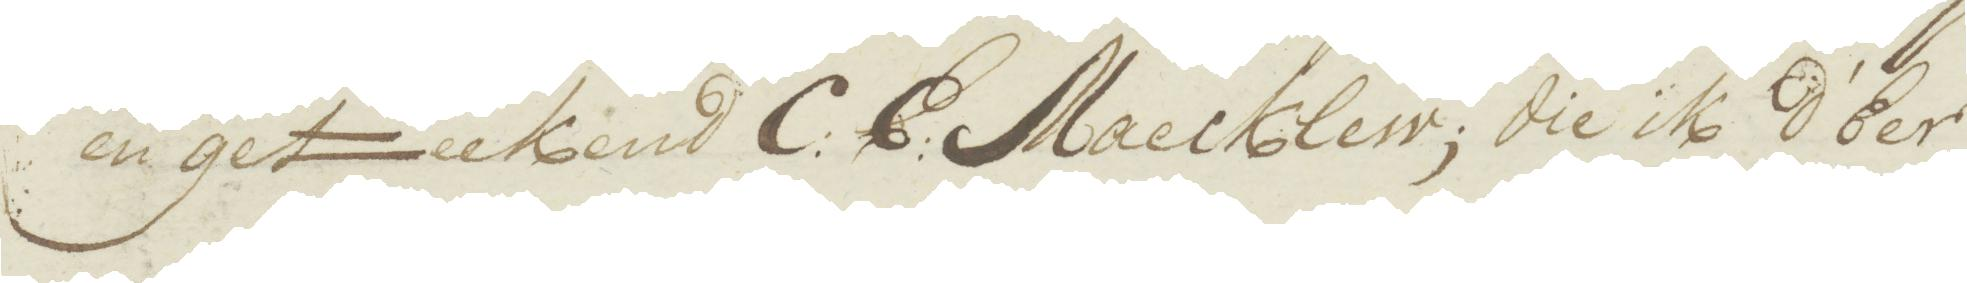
en geteekend C: E: Maecklew; die ik d’Eer
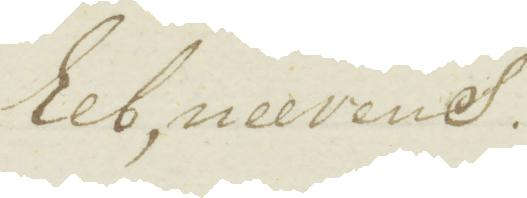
heb, neevens.
